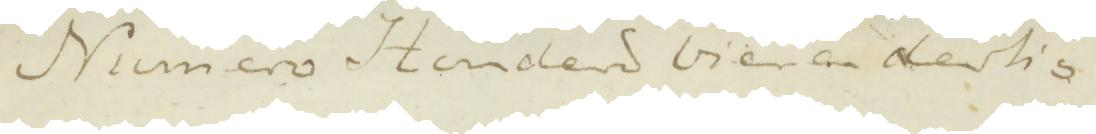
Numero Honderd vier en dertig
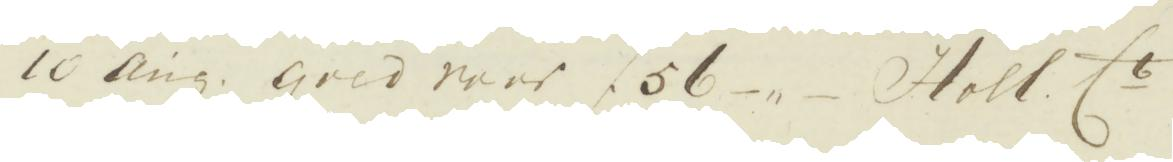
10 aug. goed voor ƒ56 -„ - Holl. C-t
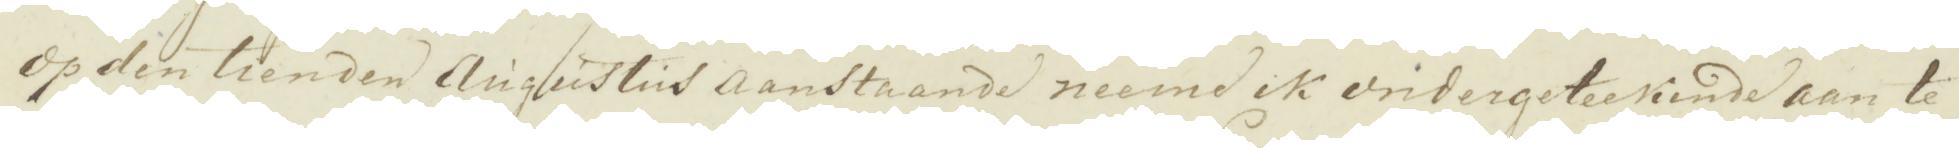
op den tienden Augustus aanstaande neeme ik ondergeteekende aan te
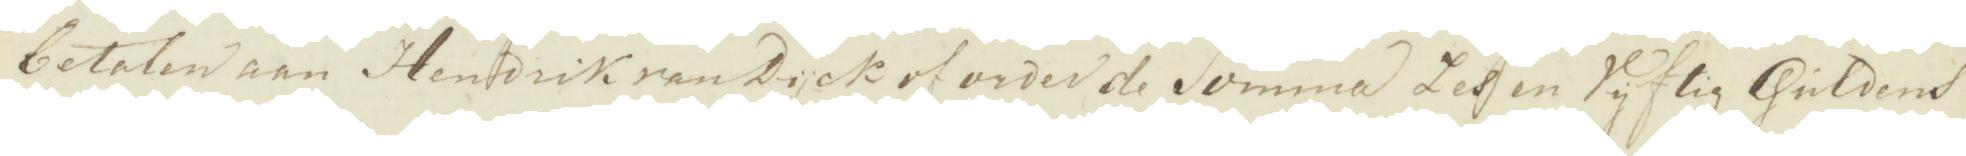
betalen aan Hendrik van Dijck of order de somma Zes en Vijftig Guldens
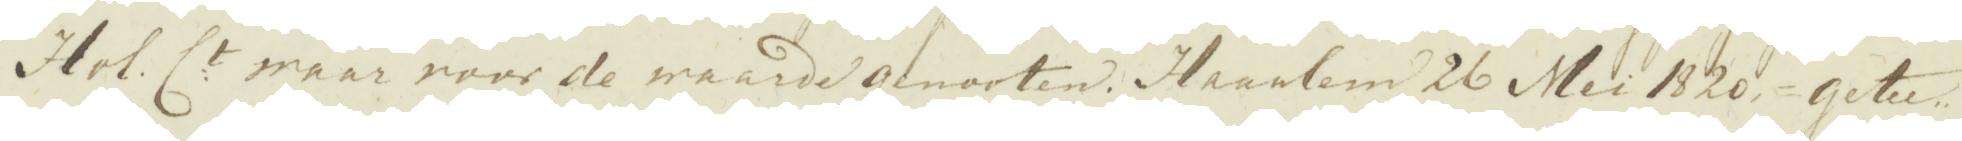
Hol. C:t waar voor de waarde genooten. Haarlem 26 Mei 1820,= getee„
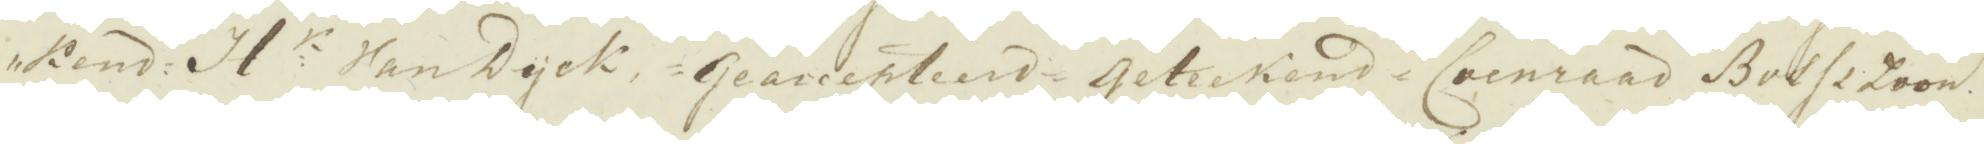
„kend: H:k Van Dijck, =geaccepteerd= geteekend = Coenraad Boss en zoon.
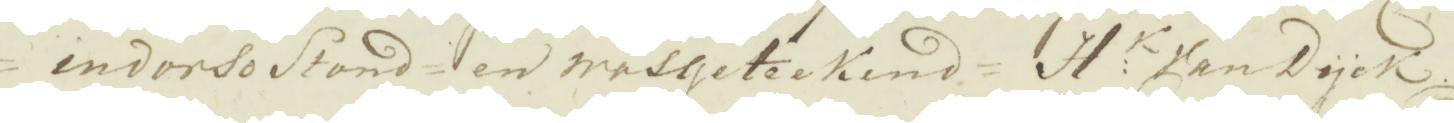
=in dorso stond= en was geteekend= H:k van Dijck
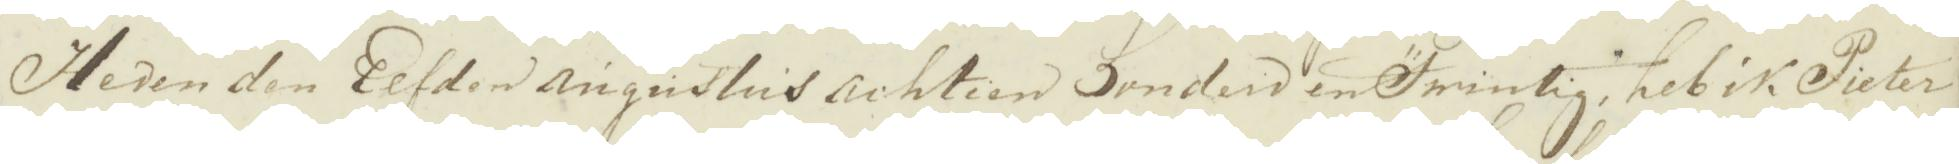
Heden den Elfden Augustus achtien Honderd en Twintig, heb ik Pieter
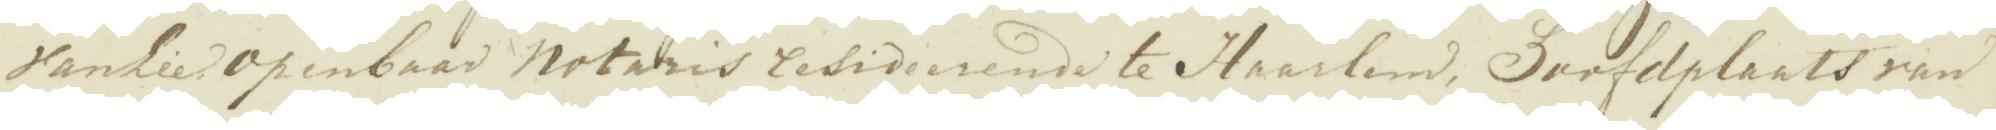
van Lee openbaar Notaris resideerende te Haarlem, Hoofdplaats van
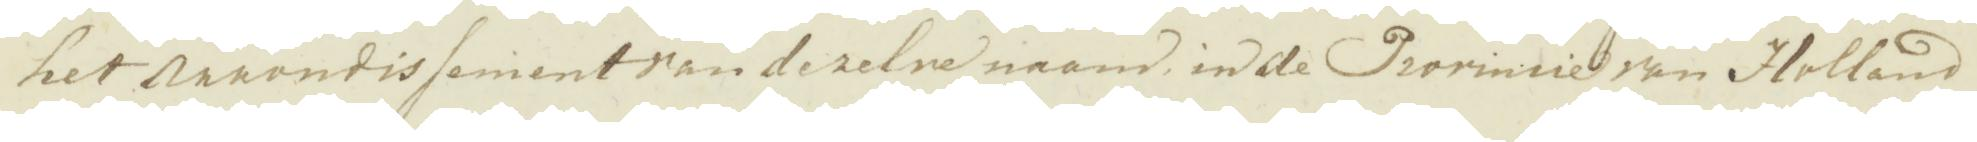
het arrondissement van dezelve naam, in de Provincie van Holland
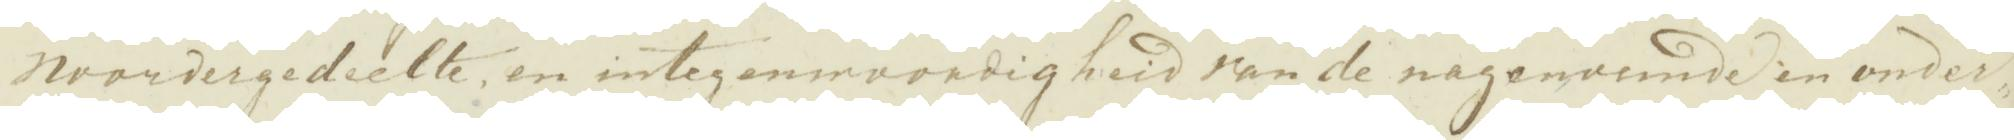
Noordergedeelte, en integenwoordigheid van de nagenoemde en onder
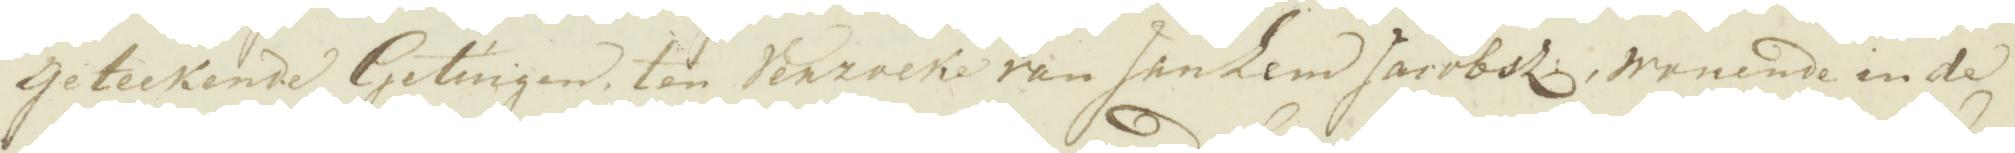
geteekende Getuigen, ten Verzoeke van Jan Lem Jacobsz:, wonende in de
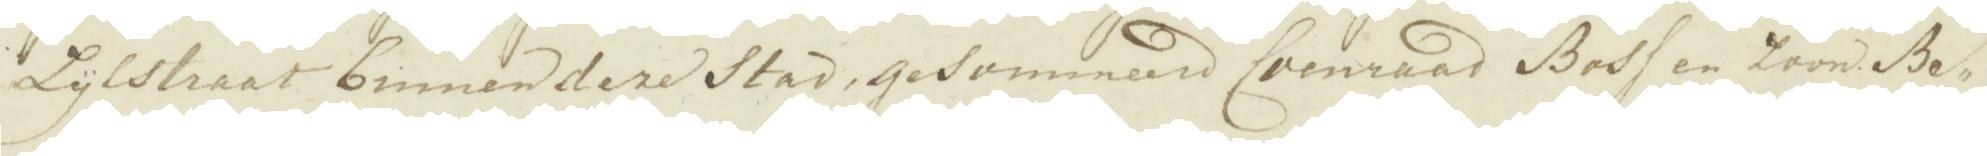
Zijlstraat binnen deze stad, gesommeerd Coenraad Boss en zoon Be„
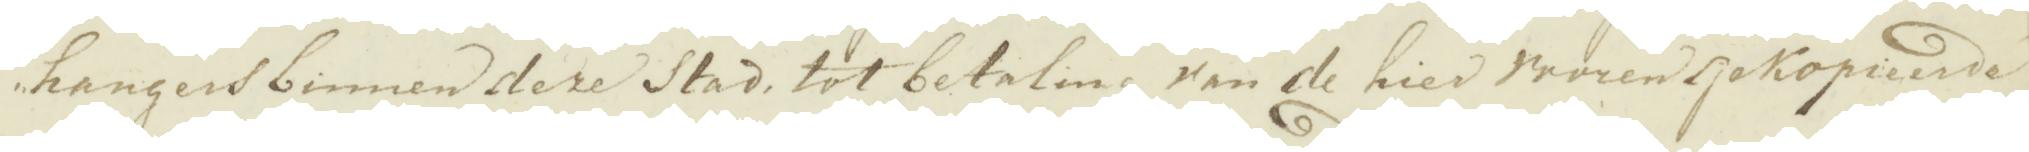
„hangers binnen deze stad, tot betaling van de hier vooren gekopieerde
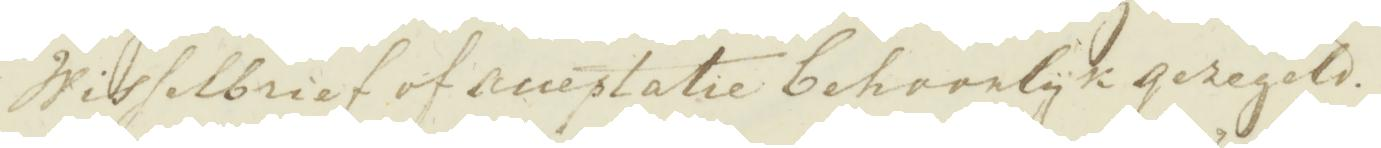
Wisselbrief of acceptatie behoorlijk gezegeld.
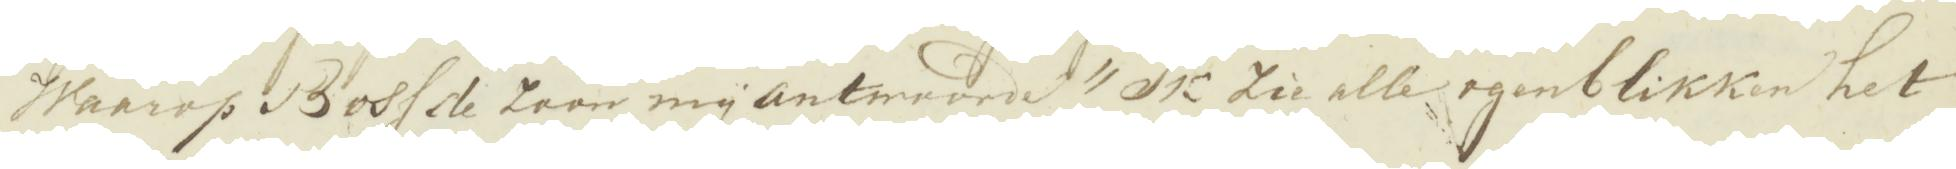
Waarop Boss de zoon mij antwoorde "Ik zie alle ogenblikken het
